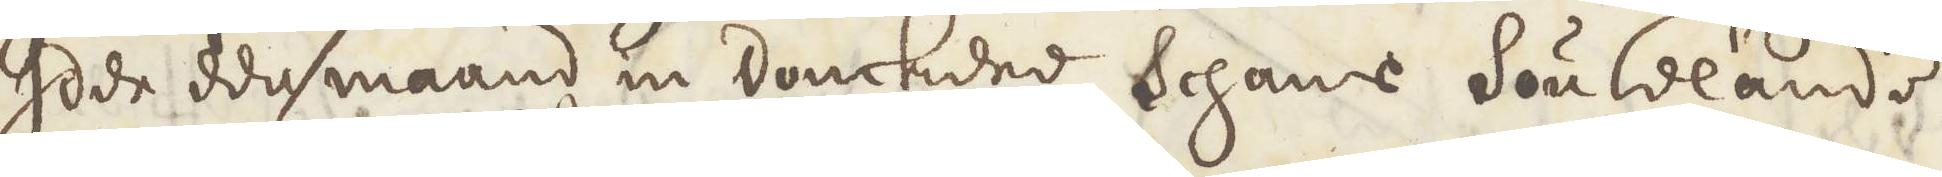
Jder een maand in donckere schans soutelande
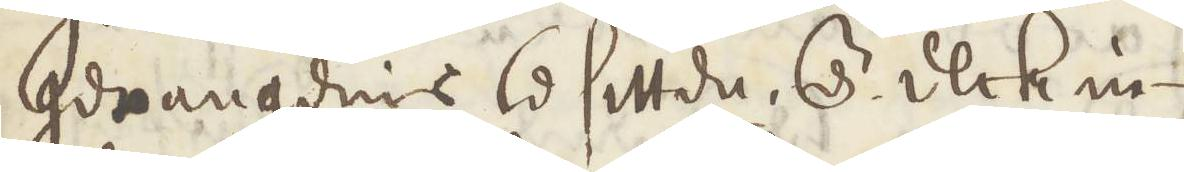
gevangenis te sitten, ende elck in-
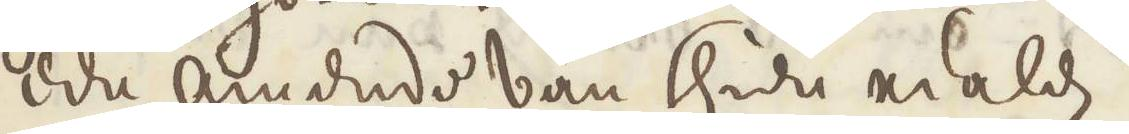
een amende van thien realen
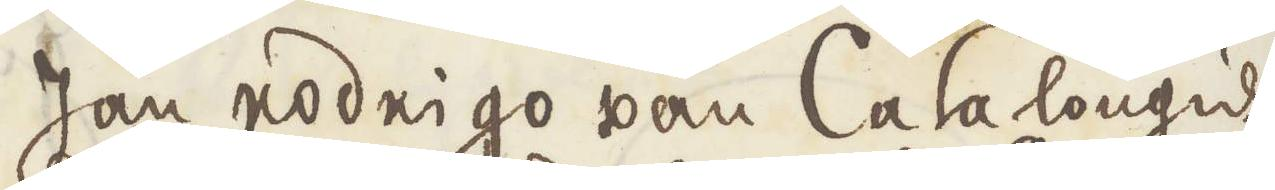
Jan rodrigo van Catalongus
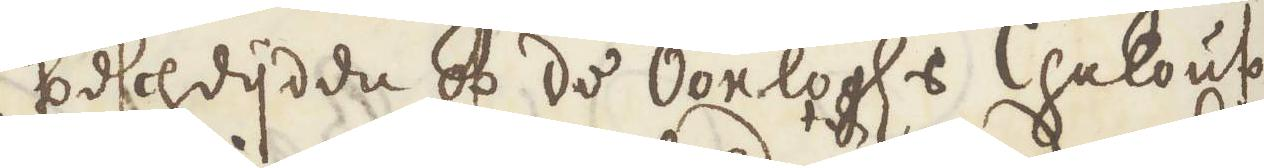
bescheijden op de Oorloghs Chaloup
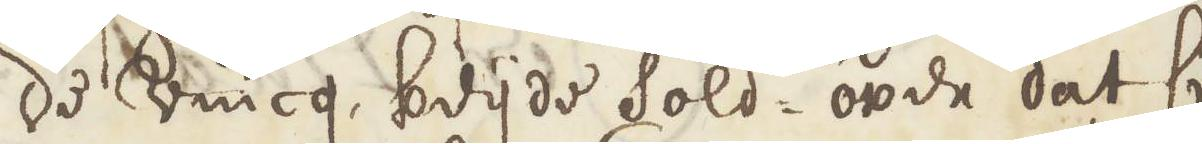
de Vincq, beijde sold=ten over dat s
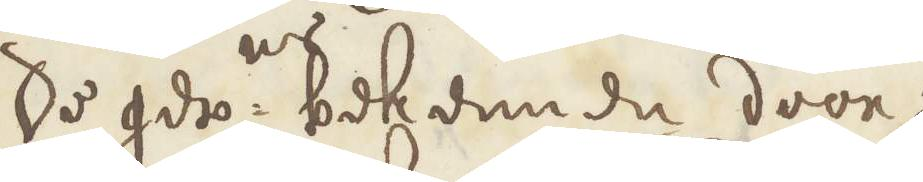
de gev=ns bekennen door
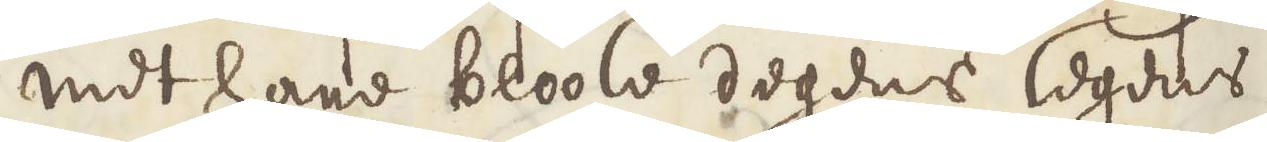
met hare bloote desens tegens
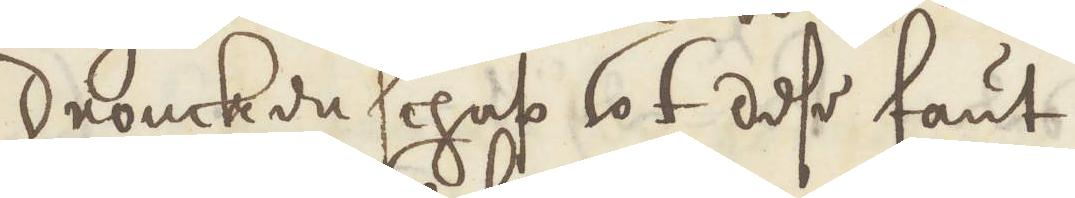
droncken schap tot dese faut
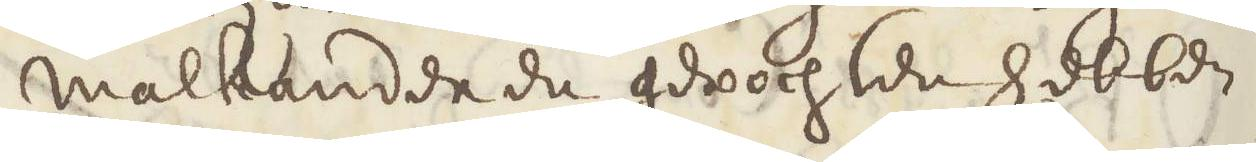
malkanderen gevochten hebben
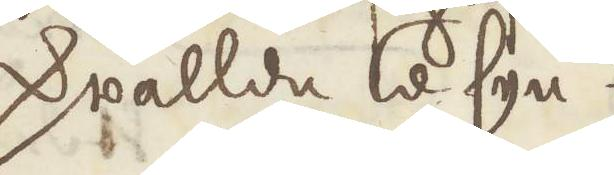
vervallen te sijn.
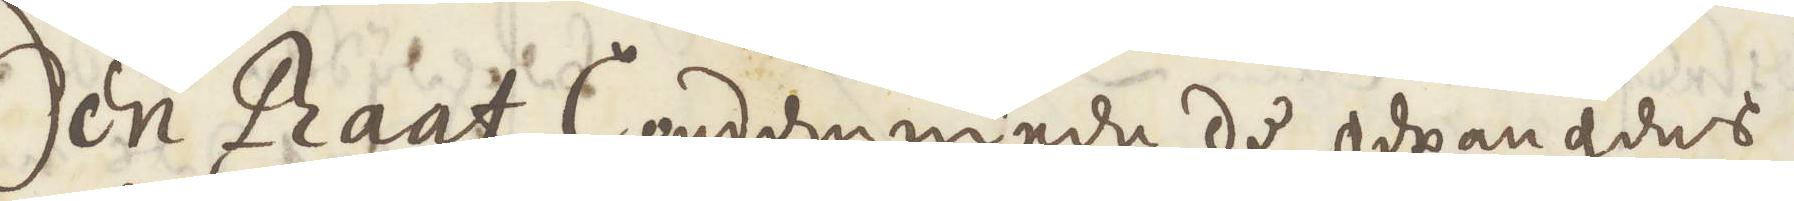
Den Raat Condemneren de gevangens
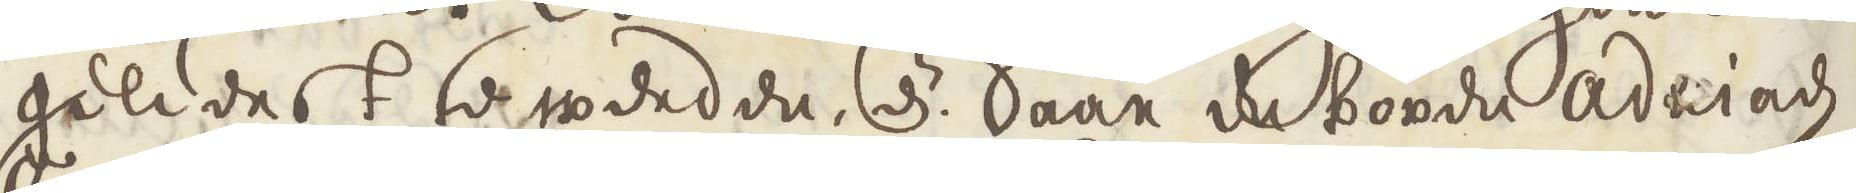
geleerst ter werden, ende daar en boven Adriaen
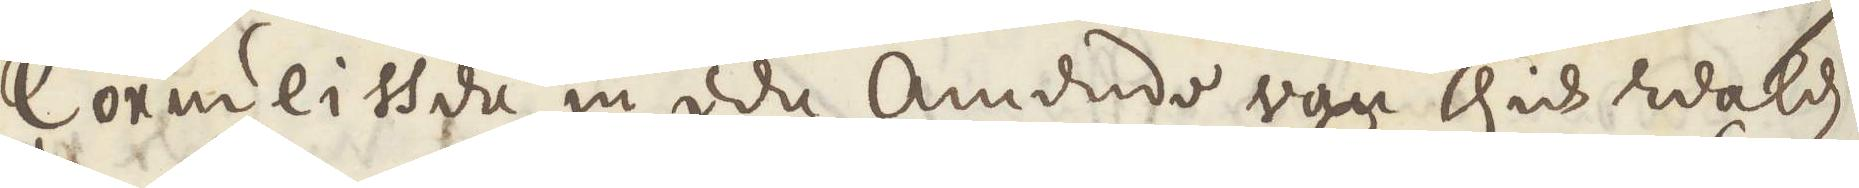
Cornelissen in een amende van thien realen
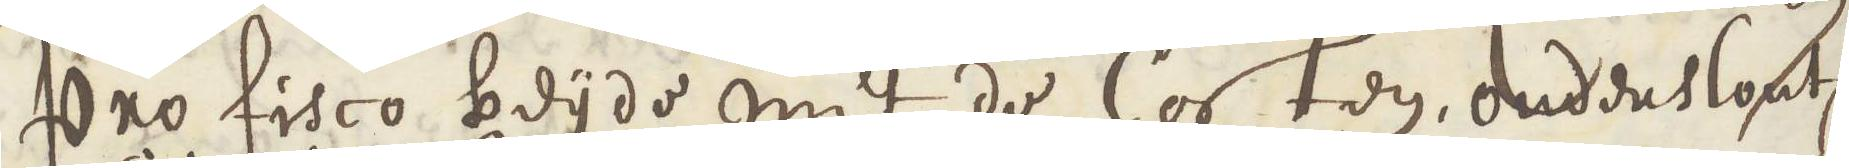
Pro fisco beijde met de Costen, onderstont
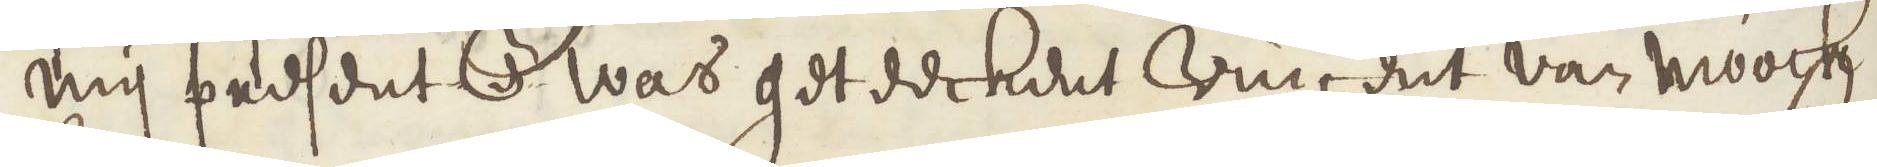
mij present ende was geteeckent Vincent van moock
